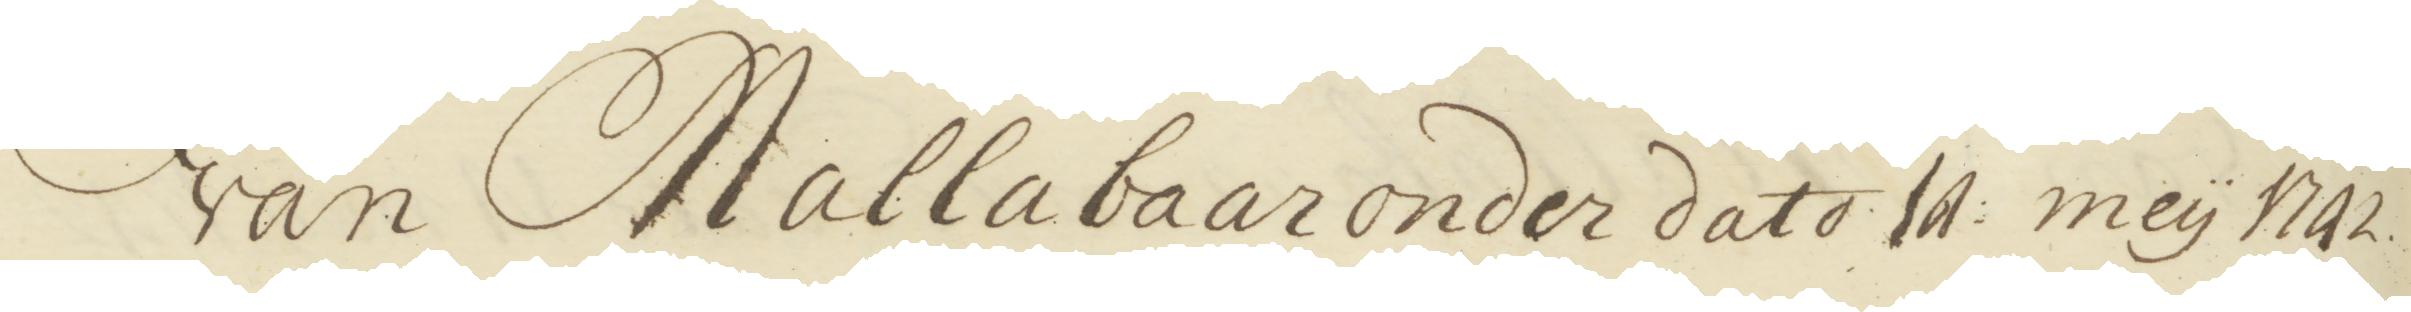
Van Mallabaar onder dato 14: meij 1742.
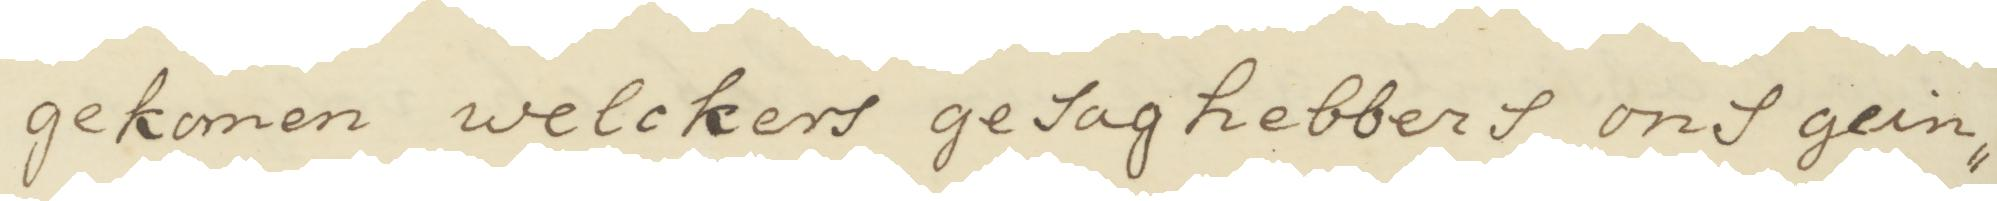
gekomen welckers gesaghebbers ons gein„
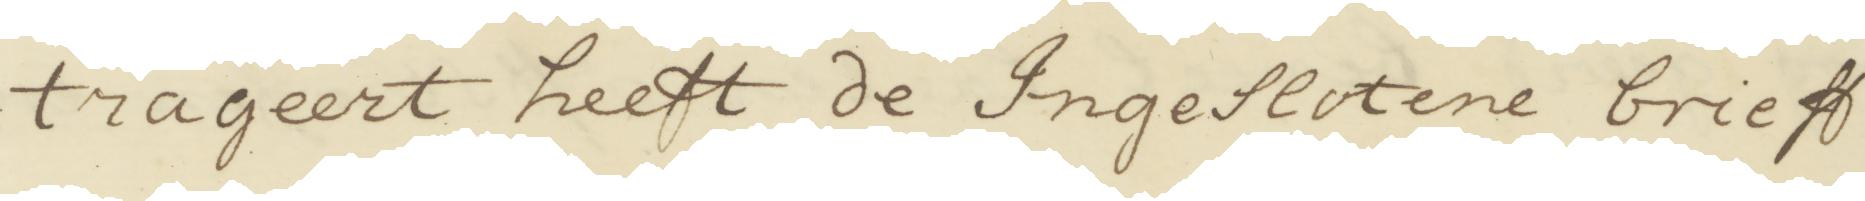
trageert heeft de Ingeslotene brieff
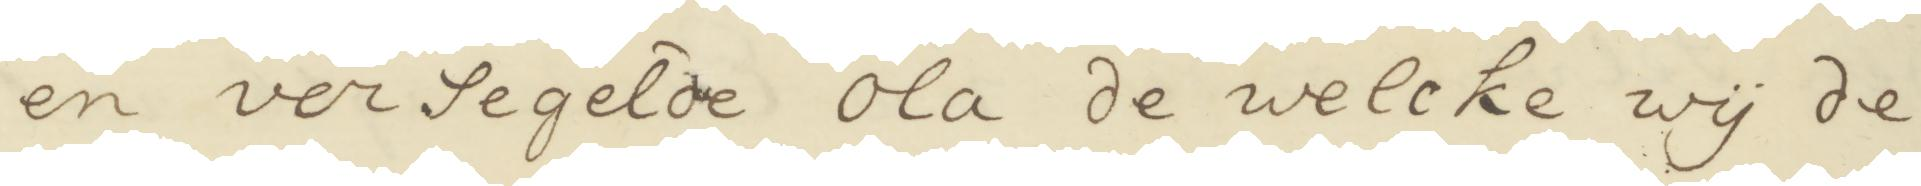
en versegelde ola de welcke wij de
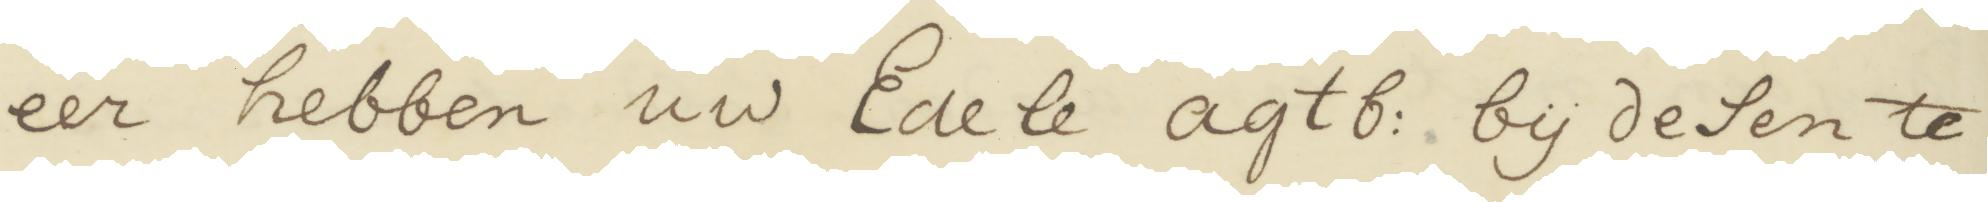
eer hebben uw Edele agtb: bij desen te
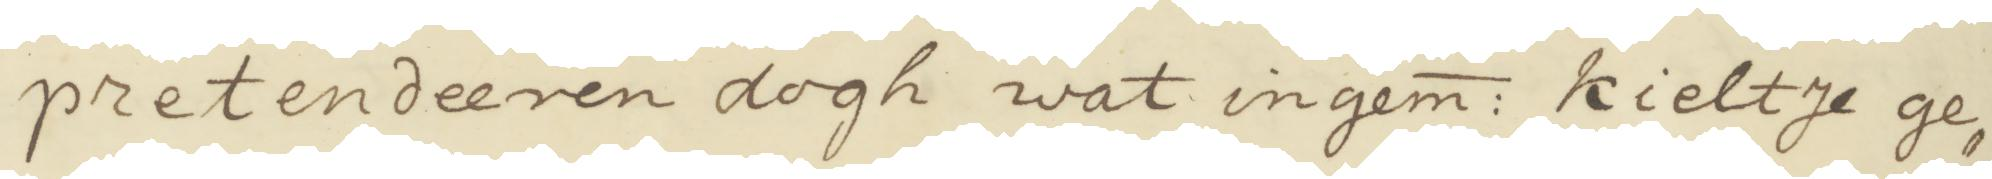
pretendeeren dogh wat in gem: kieltje ge„
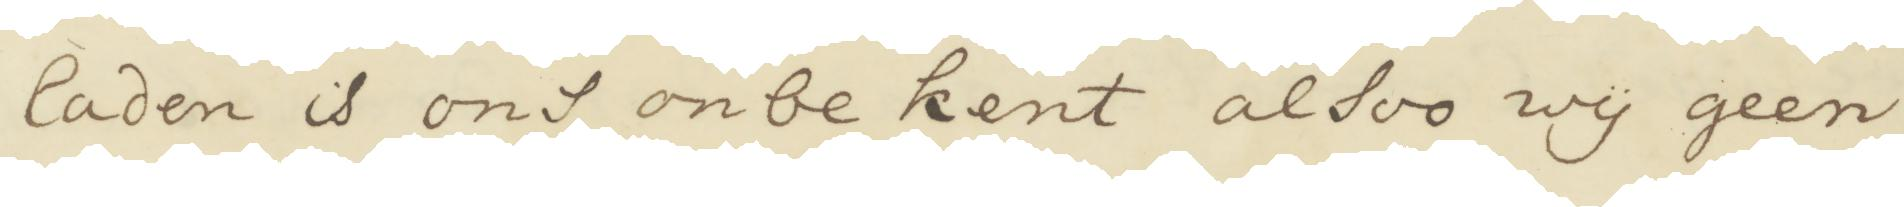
laden is ons onbekent alsoo wij geen
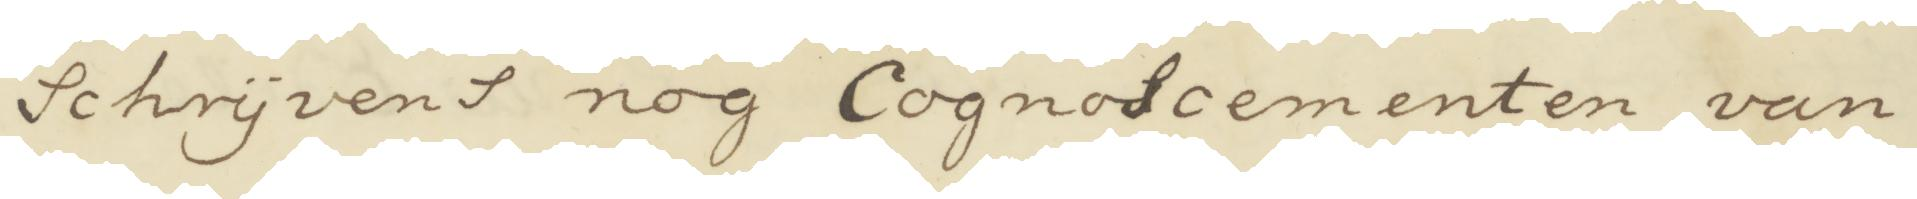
schrijvens nog Cognoscementen van
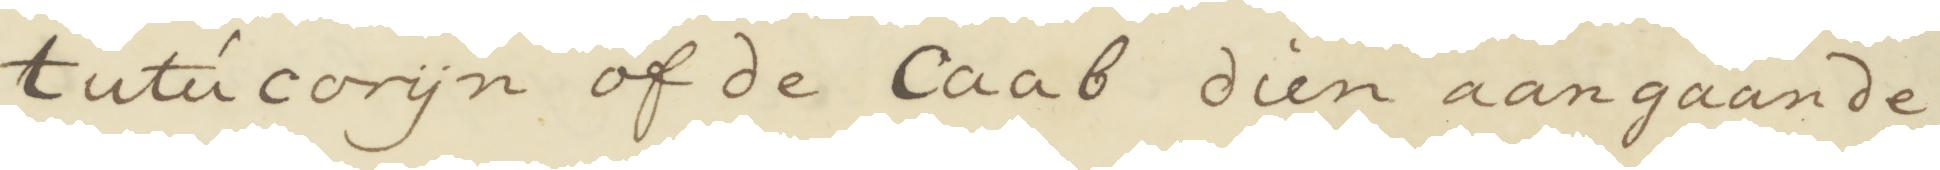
tutucorijn of de Caab dien aangaande
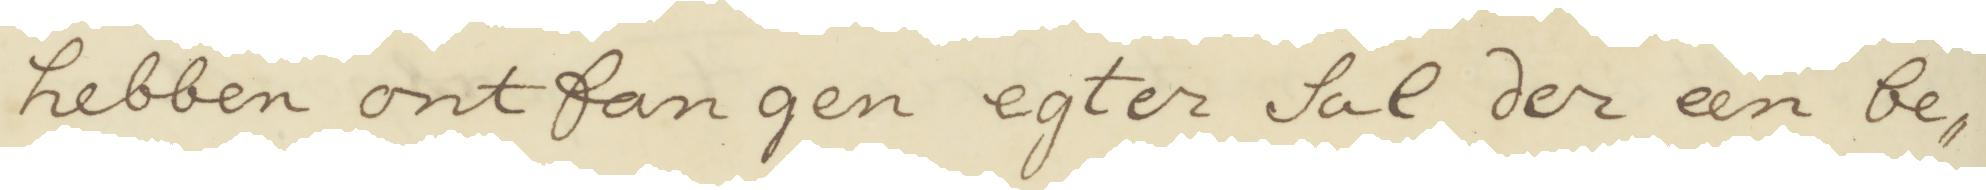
hebben ontfangen egter sal der een be„
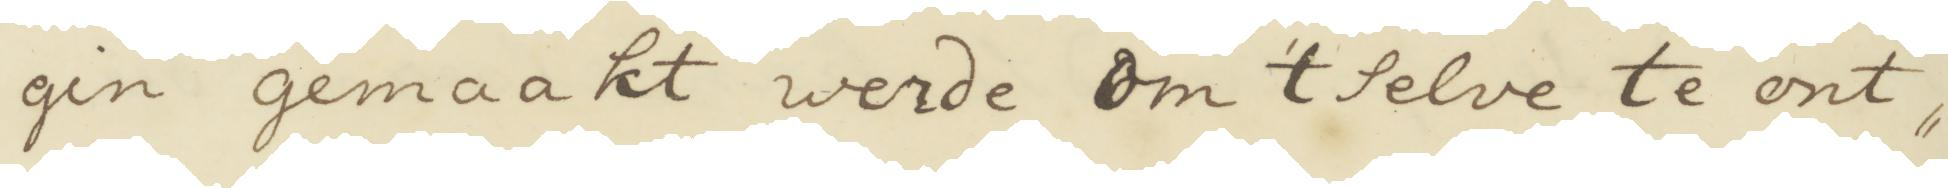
gin gemaakt werde om ’t selve te ont„
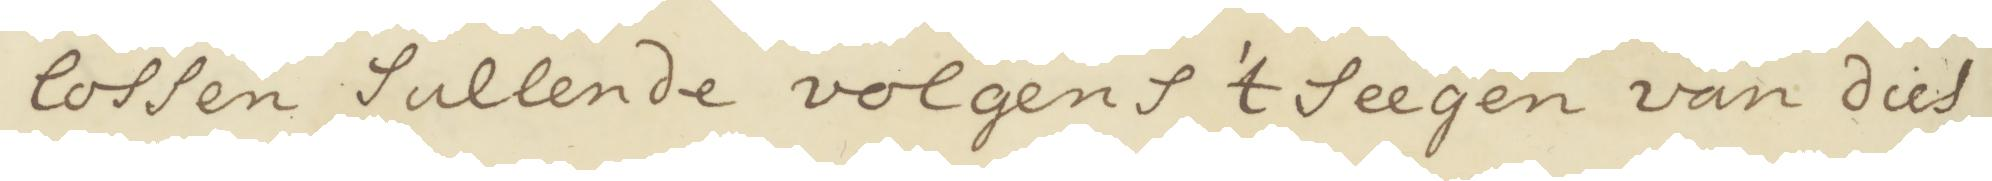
lossen sullende volgens ’t seegen van dies
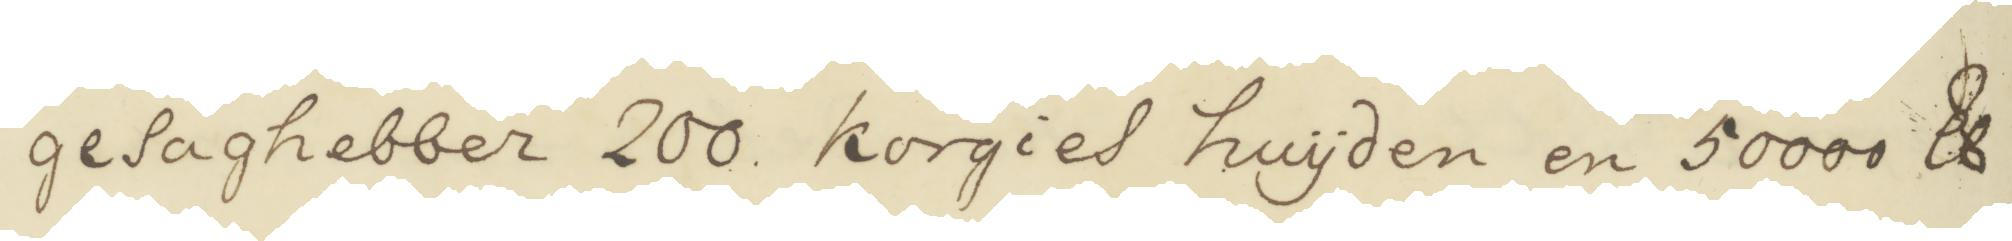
gesaghebber 200. korgies huijden en 50000 lb
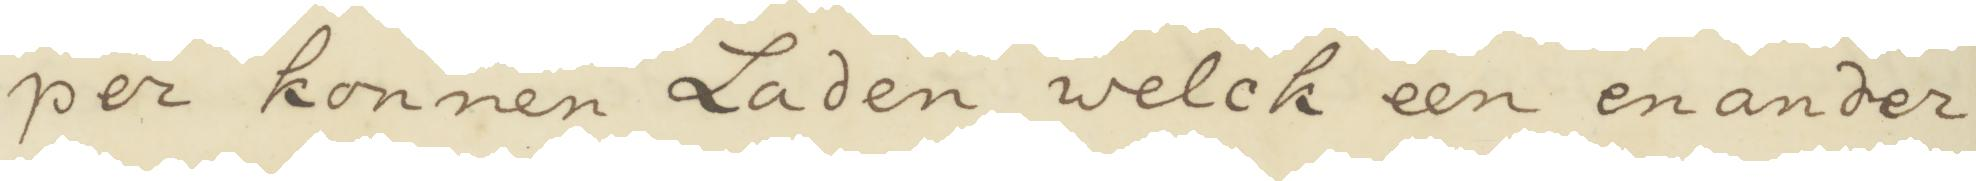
per konnen Laden welck een en ander
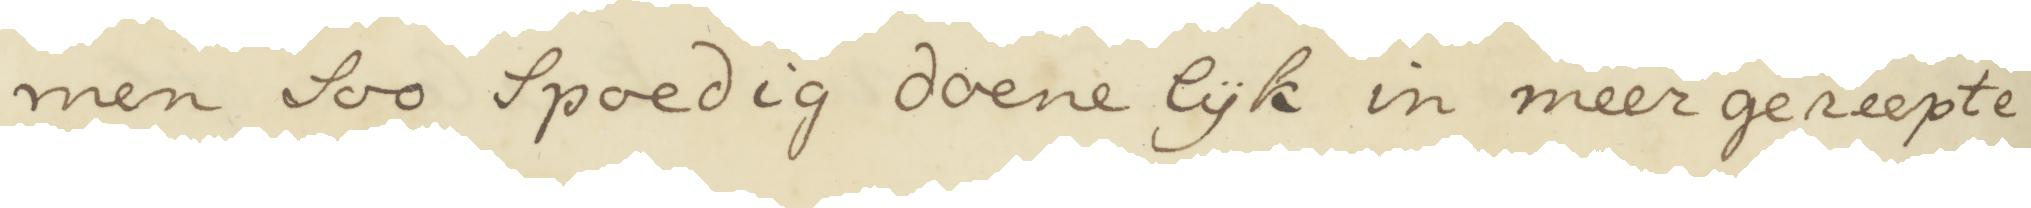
men soo spoedig doene lijk in meer gereepte
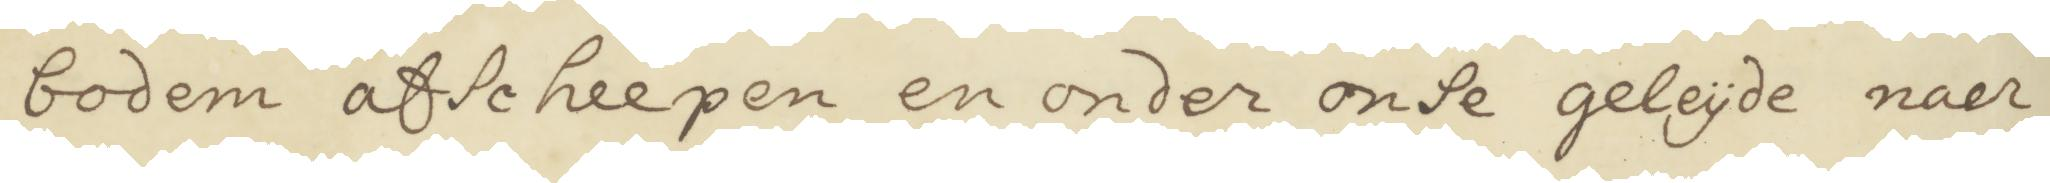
bodem afscheepen en onder onse geleijde naer
